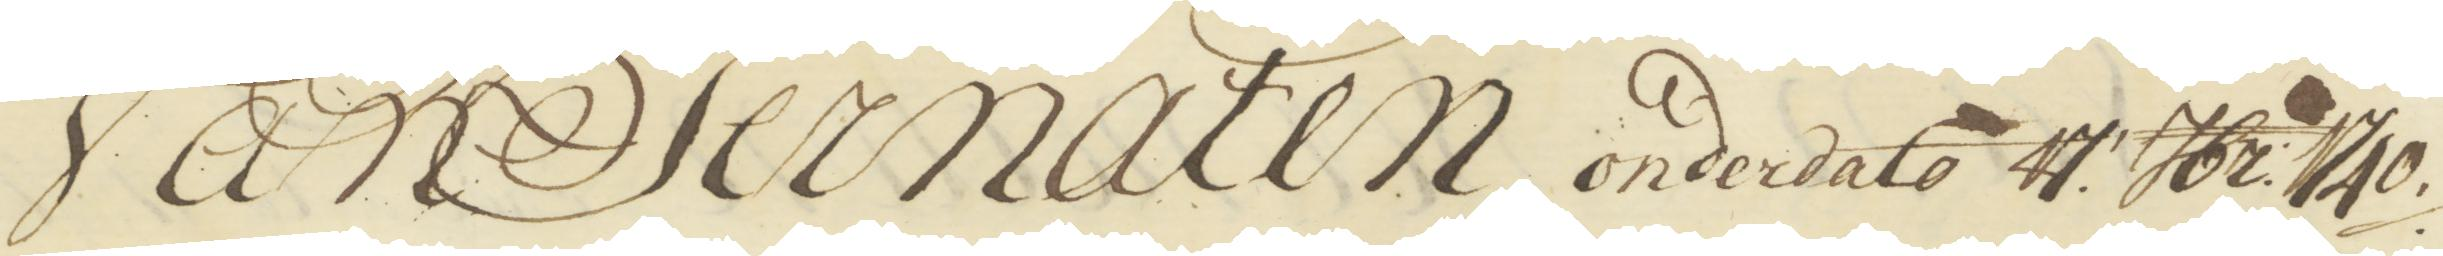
Van Ternaten, onderdato 17.' 7br: 1740.
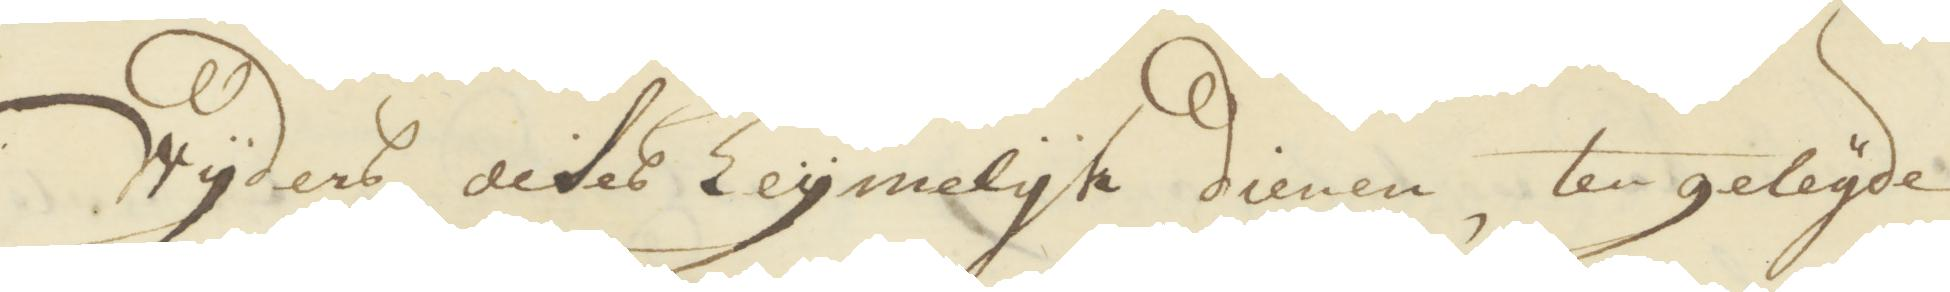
Wijders deses heijmelijk dienen ten geleijde
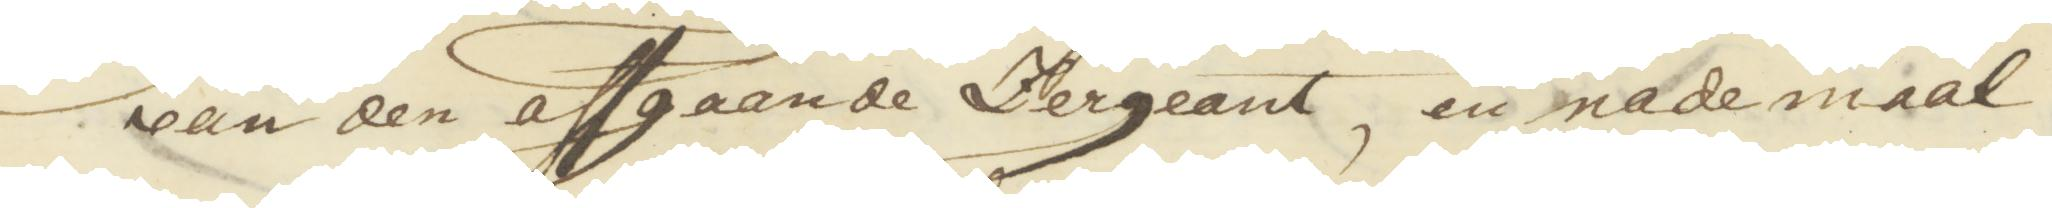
van den affgaande Zergeant, en nade maal
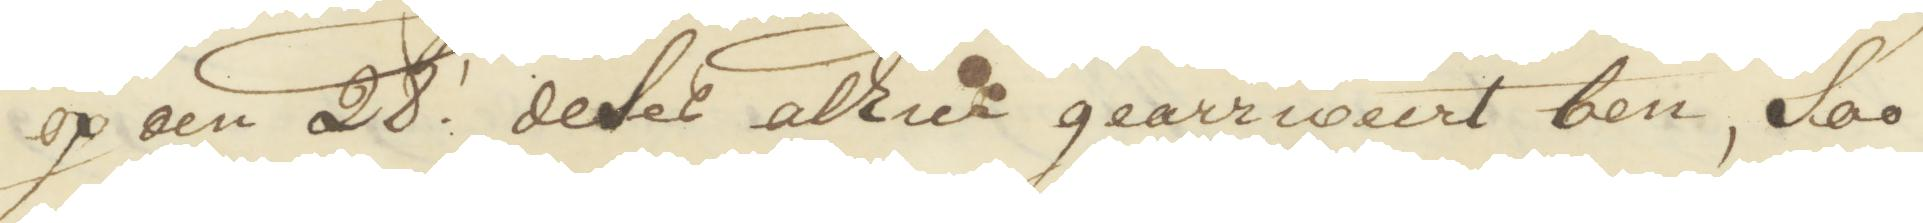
op den 28.' deses alhier gearriveert ben, soo
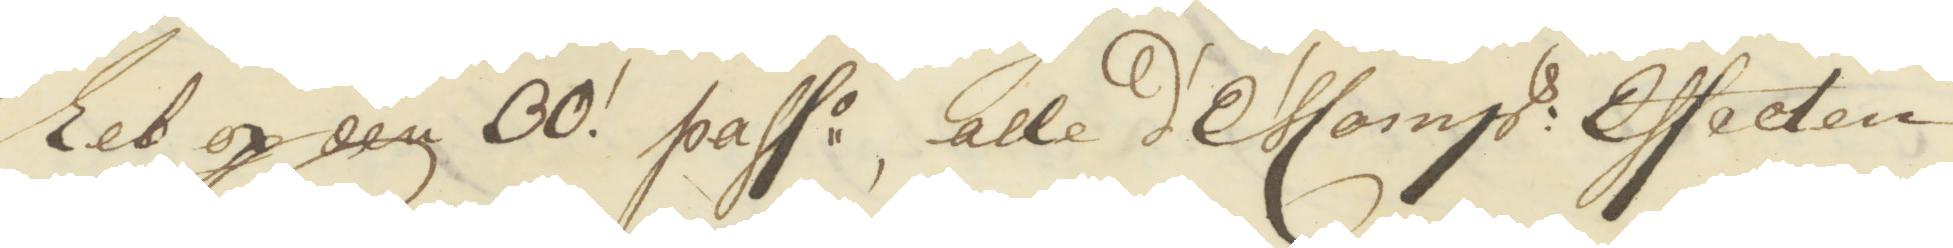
heb op den 30.' pass„o, alle d’E'SComp:s Effecten
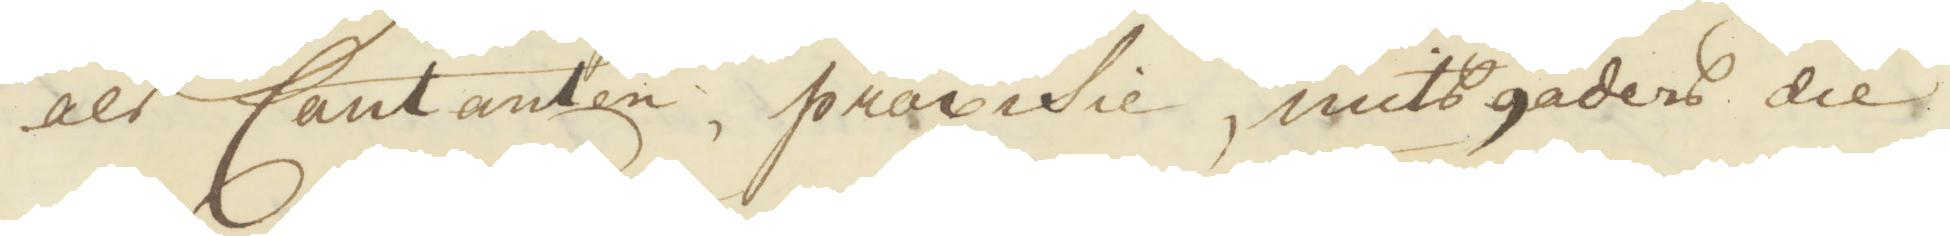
als Contanten provisie, mitsgaders die
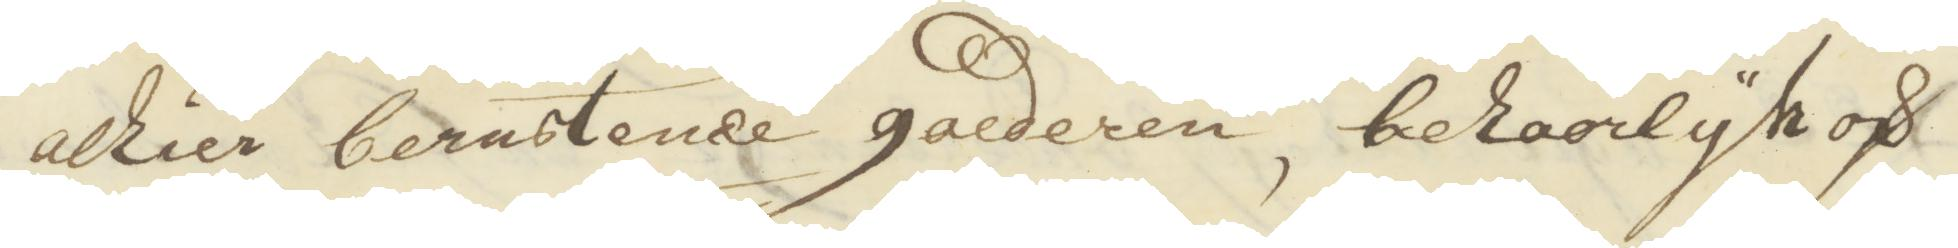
alhier berustende goederen, behoorlijk over
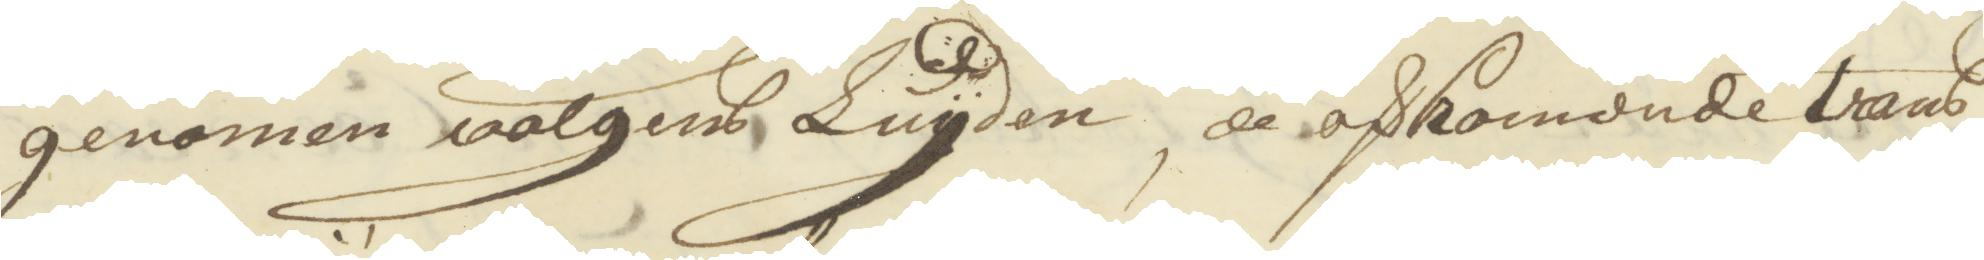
genomen volgens Luijden, de overkomende trans
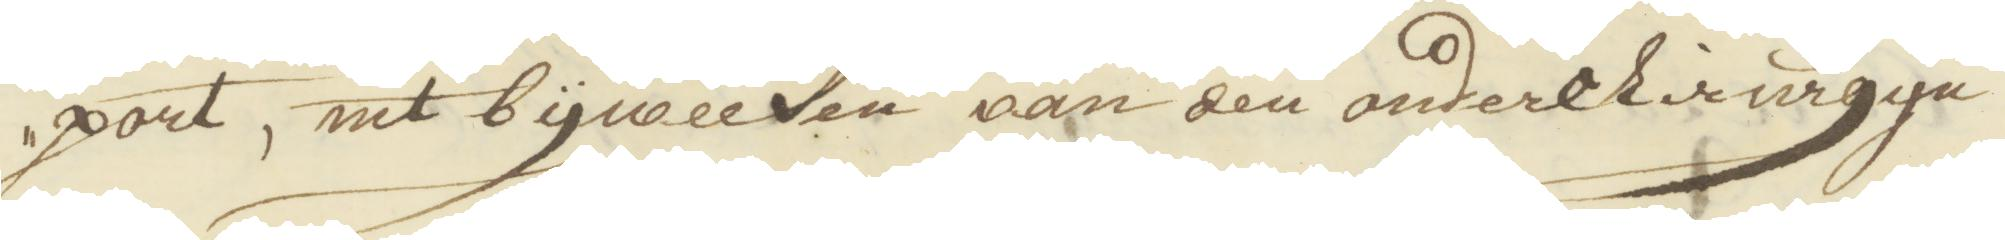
„port, in't bijweesen van den onderchirurgijn,
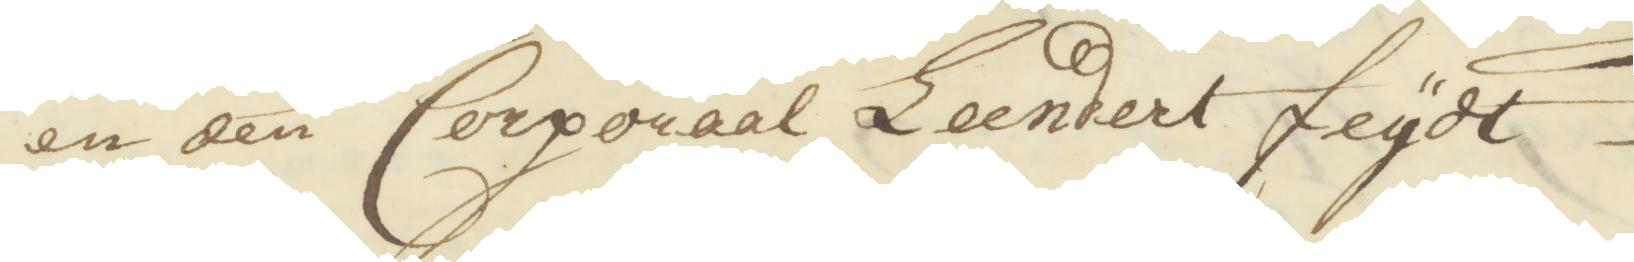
en den Corporaal Leendert feijdt
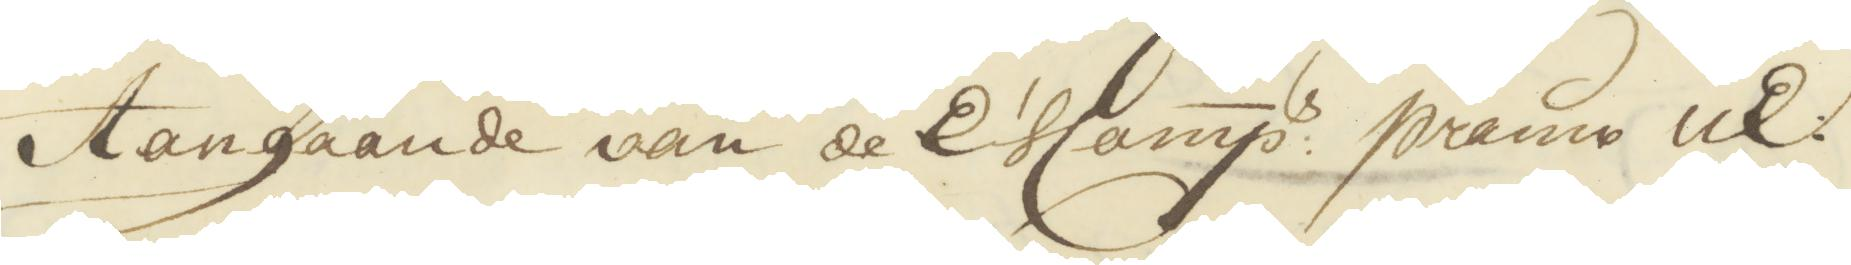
Aangaande van de E'SComp:s prauw uE:
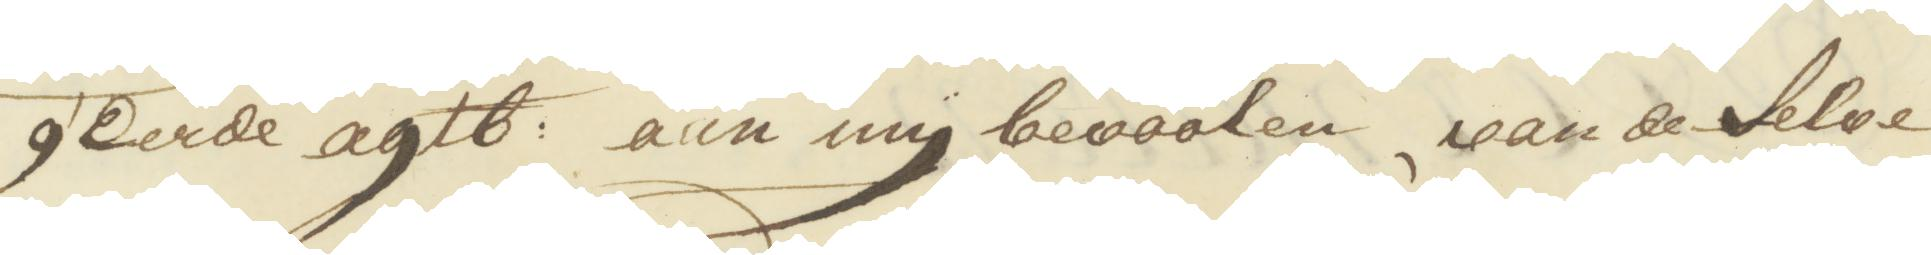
g'Eerde agtb: aan mij bevoolen, van de selve
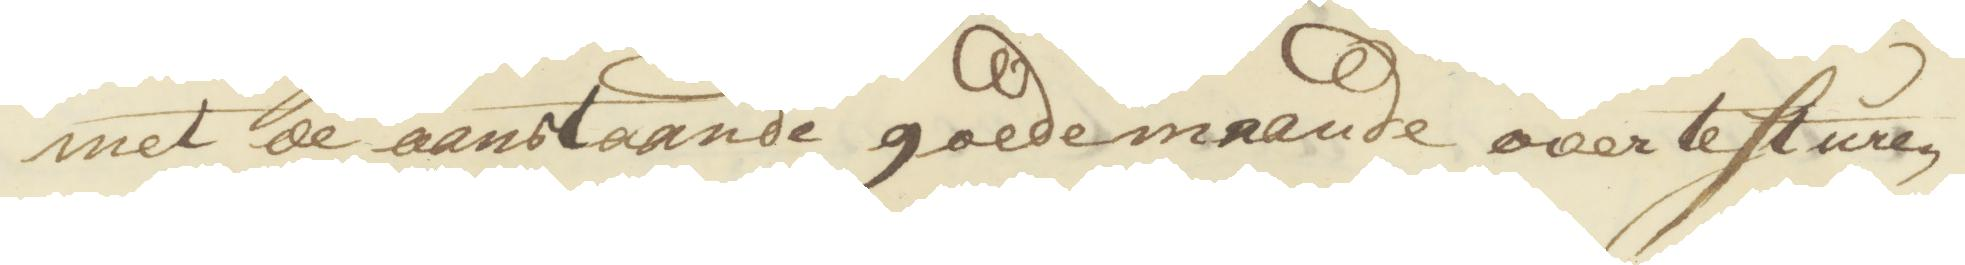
met de aanstaande goede maande over te sturen
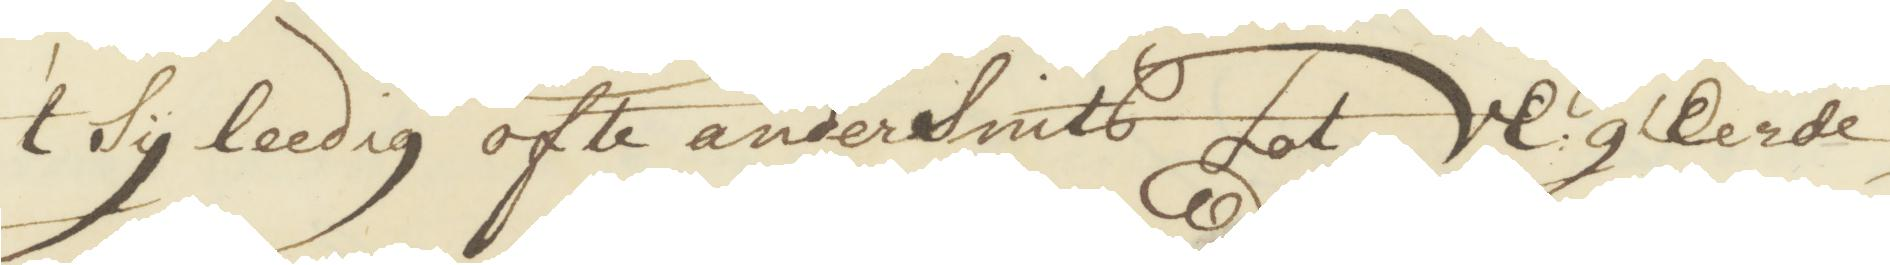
’t sij leedig ofte andersints tot VE: g’Eerde
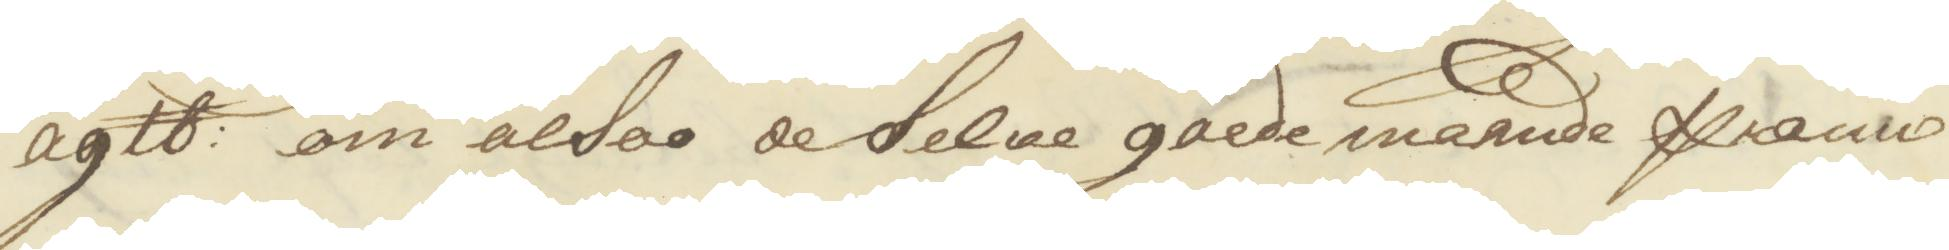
agtb: om alsoo de selve goede maande prauw
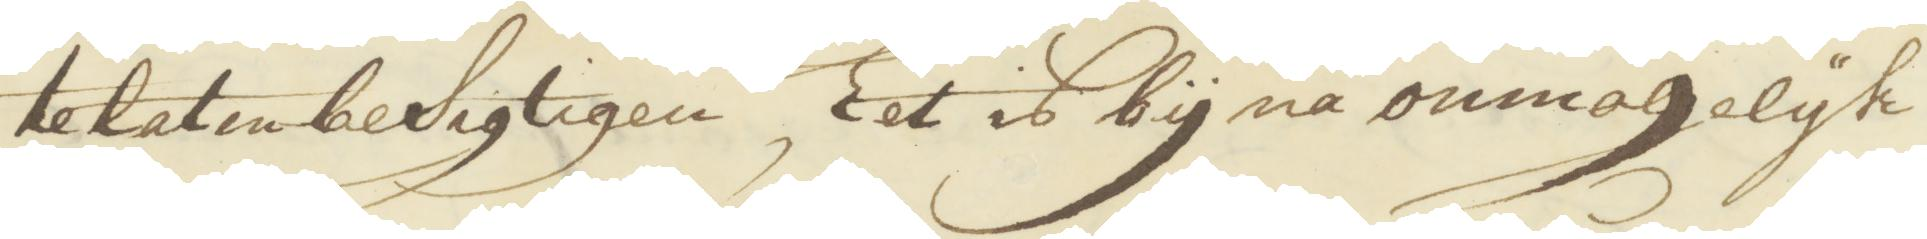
te laten besigtigen, het is bij na onmogelijk
